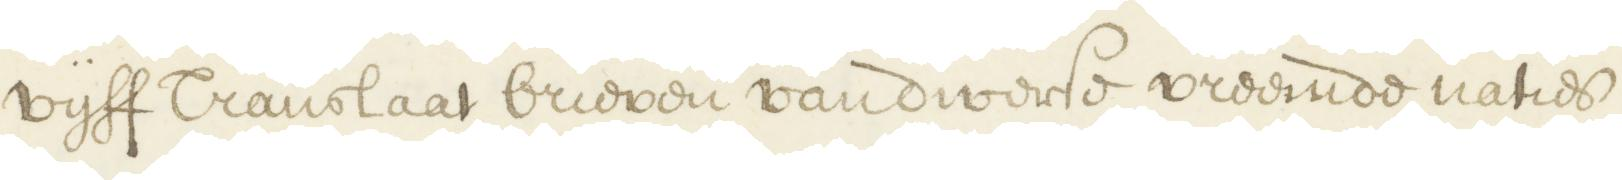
vijff Translaat brieven van diverse vreemde naties
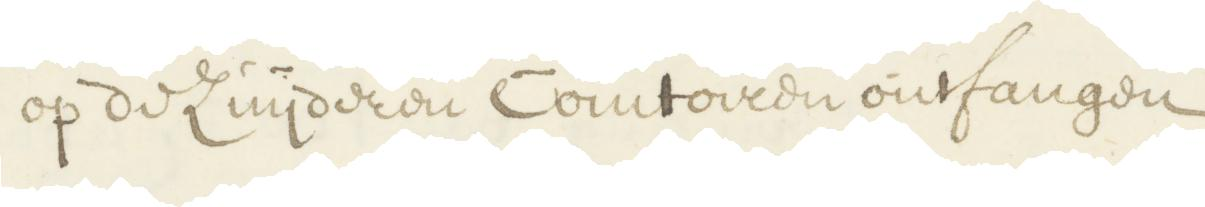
op de Zuijderen Comtoiren ontfangen
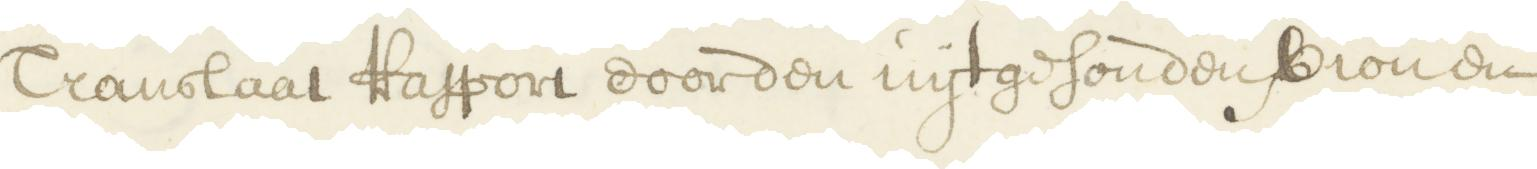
Translaat Rapport door den uijtgesonden pionen
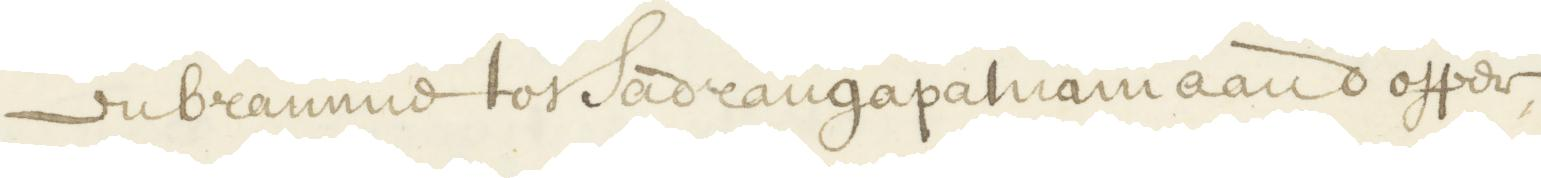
en bramine tot Sadrangapatnam aan d’ opper
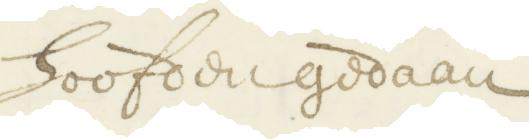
hoofden gedaan
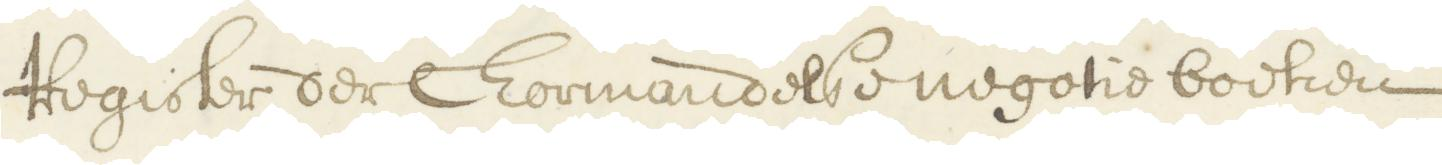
Register der Chormandelse negotie boeken
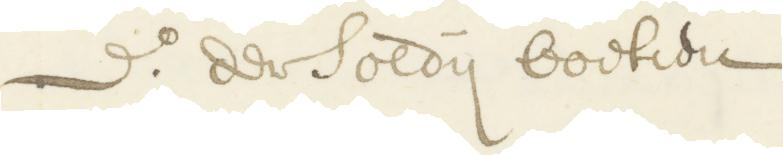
_.o der soldij boeken
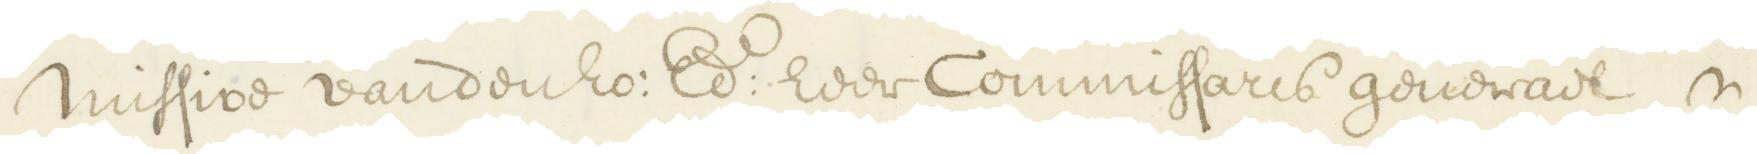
missive van den ho: Ed:s heer Commissaris generael
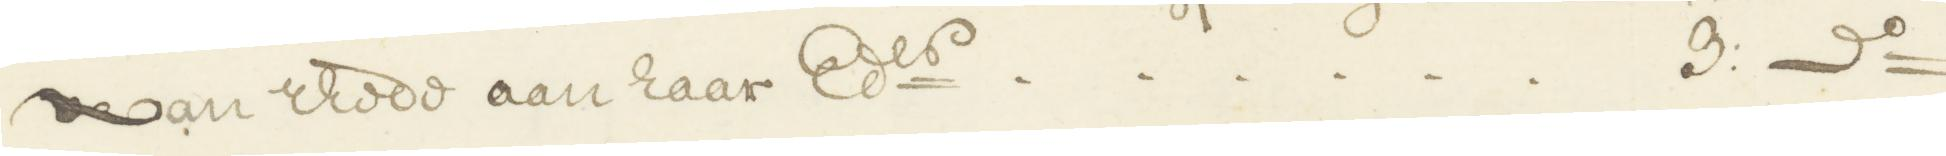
van rhede aan haar Ed=ls . . . . . . 3:' _=o
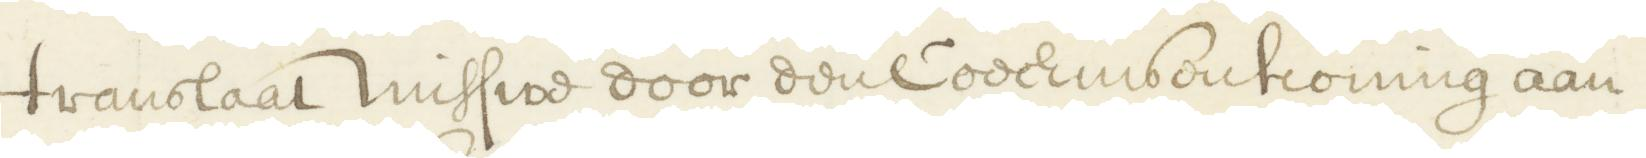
translaat missive door den Coechinsenkoning aan
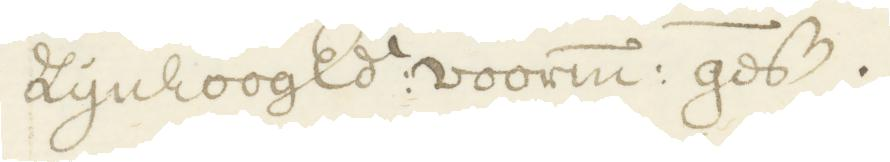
zijn hoog Ed:l voorm: ges.
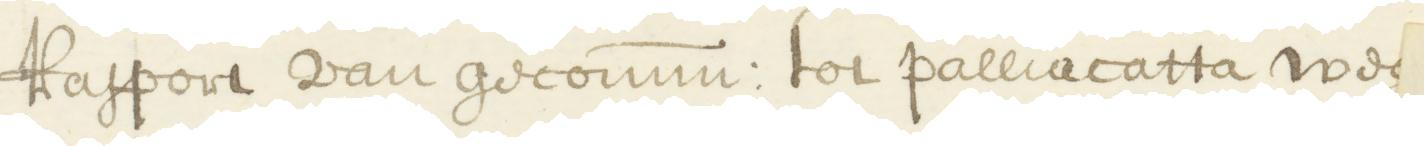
Rapport van gecomm: tot palliacatta we
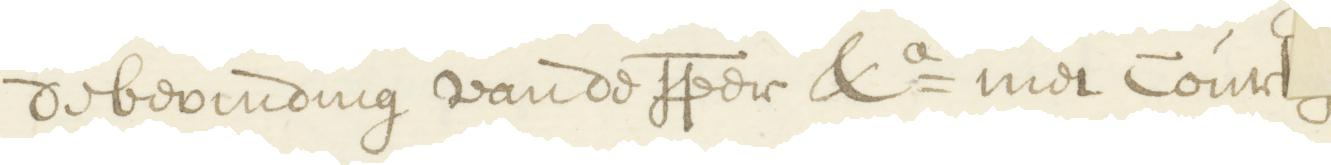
de bevinding van de pper Et=a met Cour
